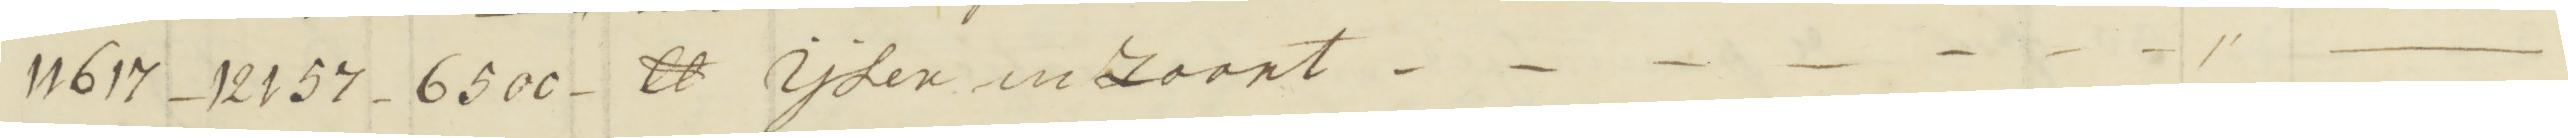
11617 - 12157 - 6500 - lb ijser in zoort - - - - - - - „ —
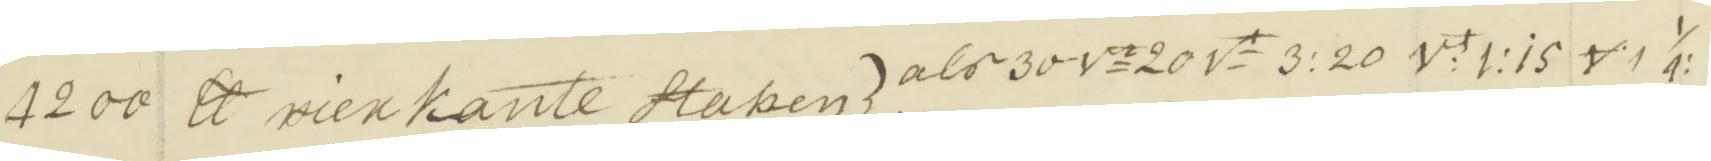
4200 lb vierkante staven als 30 V=t 20 V=t 3:20 V:t 1:15 V:t ¼:
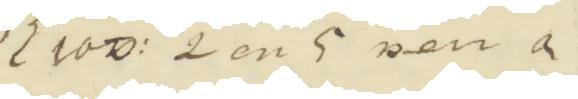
100: 2 en 5 ven a
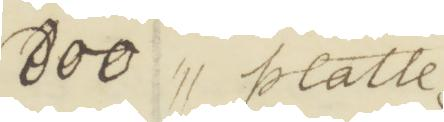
800 „ platte
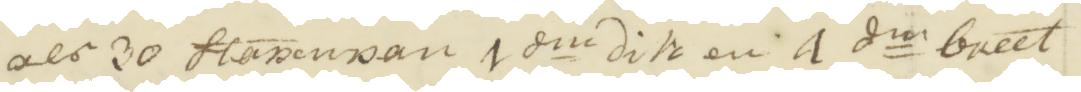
als 30 staven van 1 d-m dik en 4 d=m breet
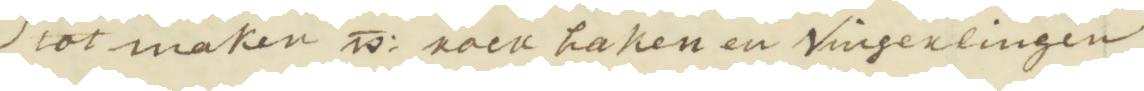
tot maken v: roer haken en vingerlingen
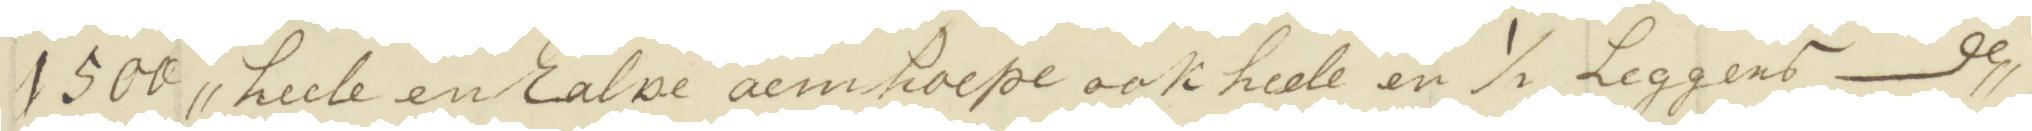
1500 „ heele en halve aemhoepe ook heele en ½ Leggers _„o
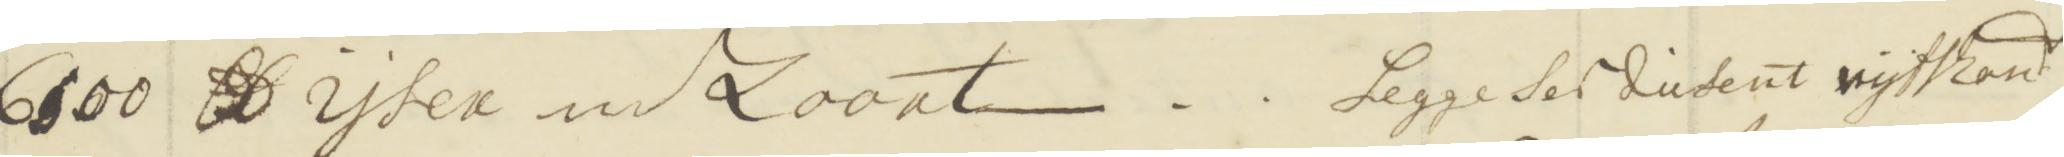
6500 lb ijser inzoort segge ses dusent vijffhon:
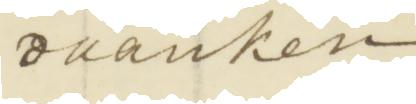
dranken
